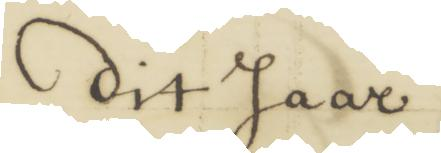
dit Jaar
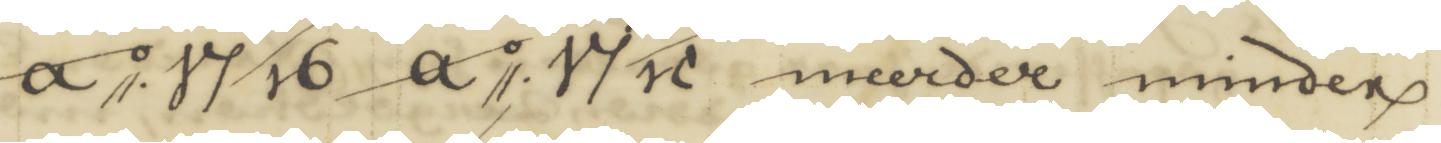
a„o 17 15/16 a„o 17 14/15 meerder minder
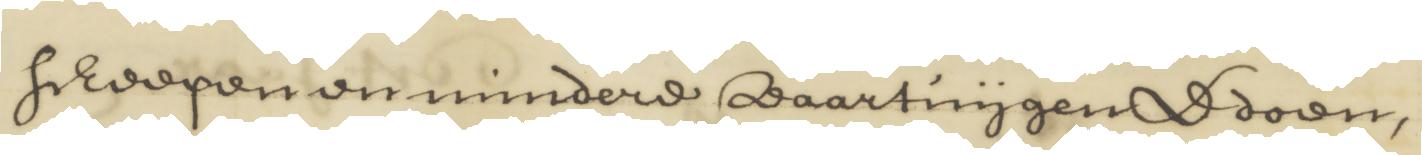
scheepen en mindere vaartuijgen te doen,
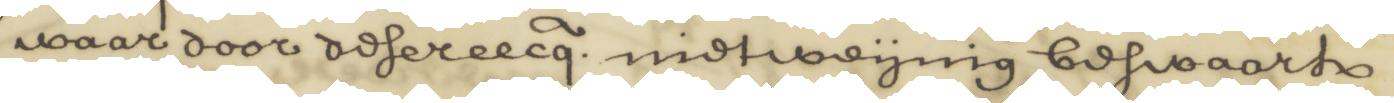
waar door dese reecq. niet weijnig beswaarts
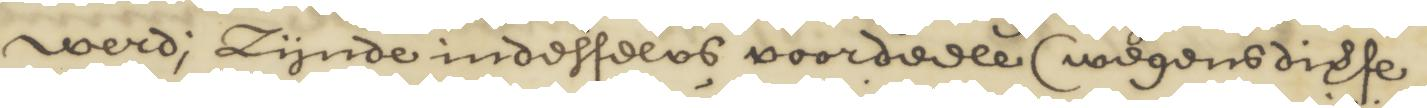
werd; zijnde indesselvs voordeele (wegens diverse
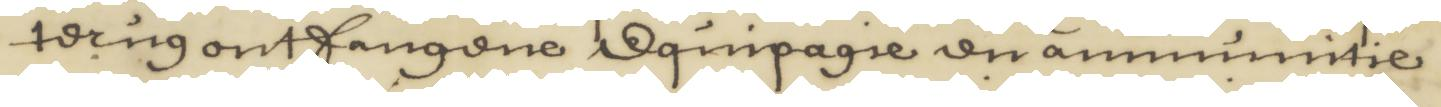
terug ontfangene Equipagie en ammunitie
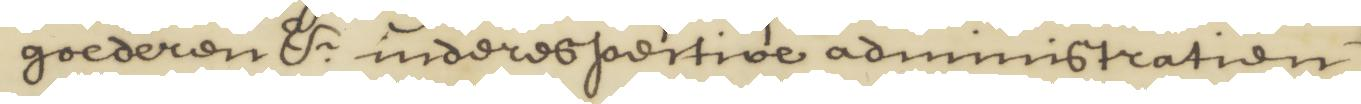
goederen Ed:n in de respective administratien
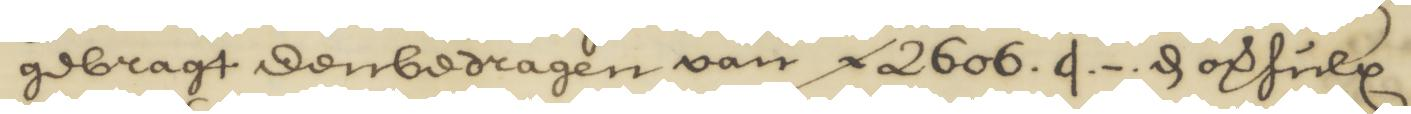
gebragt Eenbedragen van ƒ2606.4.-. en oversulx
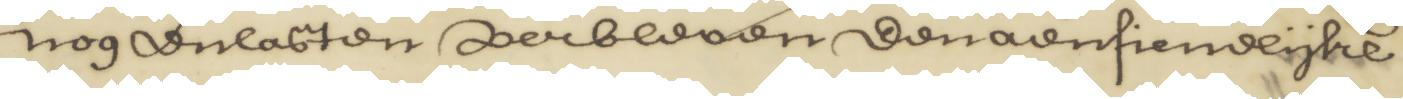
nog tenlasten verbleven Een aensienelijke
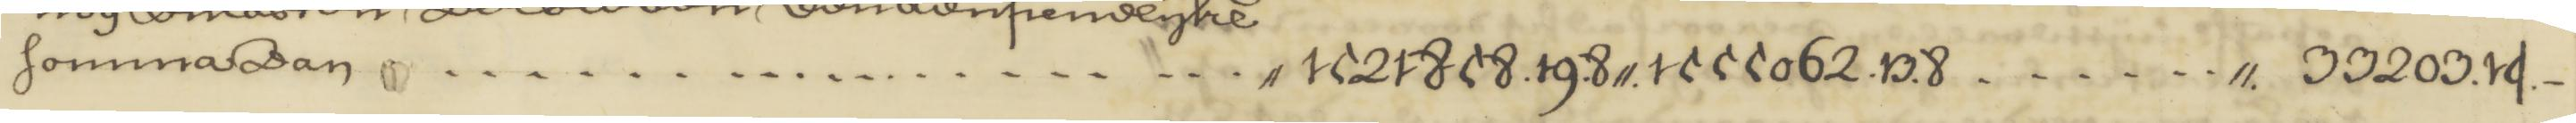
somma van . . . . . . . . . . . . . . . . . . . . . . „ 1521858.19.8„.1555062.13.8 . . . . . . „33203.14.-
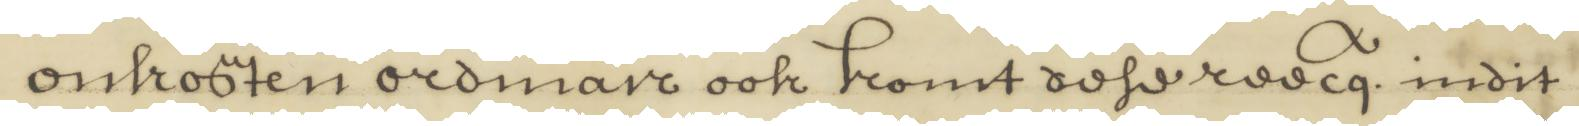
onkosten ordinair ook komt dese reecq. in dit
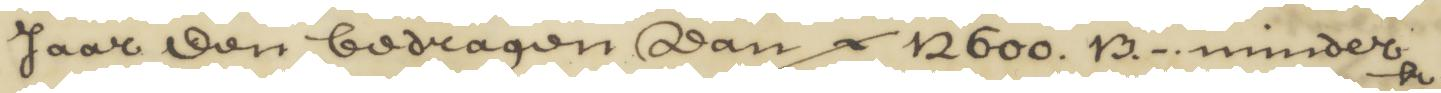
Jaar Een bedragen van ƒ 12600. 13.-. minder
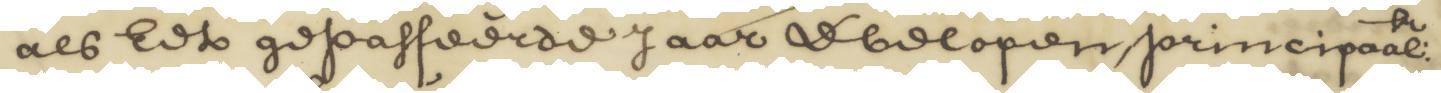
als het gepasseerde Jaar tebelopen, principaal:k
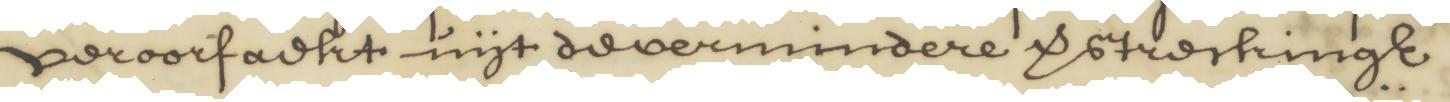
veroorsaekt uijt de vermindere verstreckingh
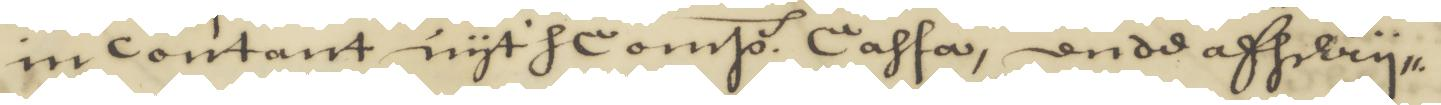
in contant uijt ’s Comp.s Cassa, ende afschrij„
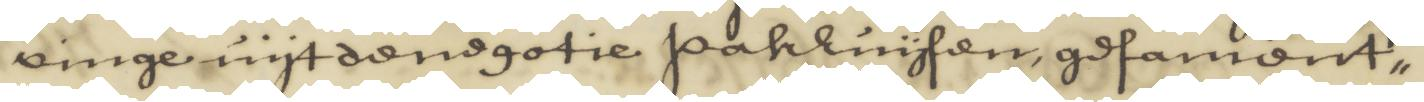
vinge uijt de negotie pakhuijsen, gesament„
